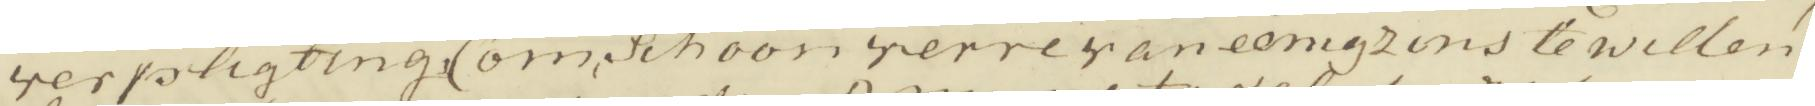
verpligting (om, schoon verre van eenigzins te willen
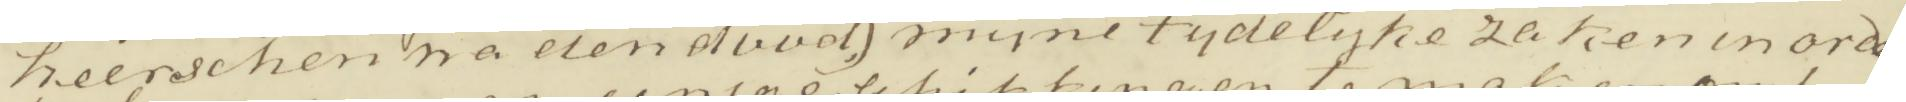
heerschen na den dood,) myne tydelyke zaken in orde
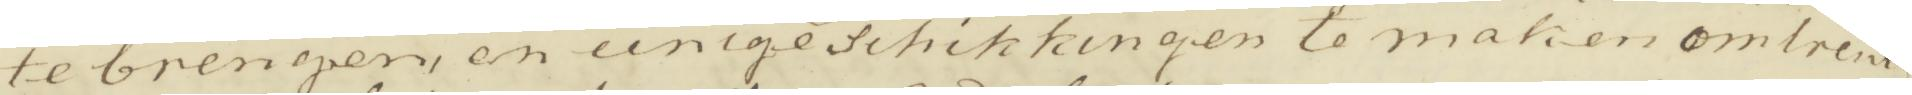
te brengen, en eenige schikkingen te maken omtrent
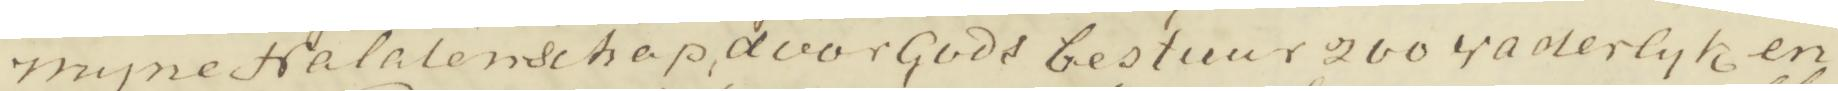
myne Nalatenschap, door Gods bestuur zoo vaderlyk en
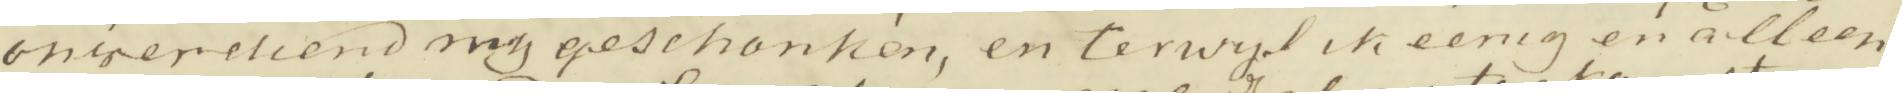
onverdiend my geschonken, en terwyl ik eenig en alleen
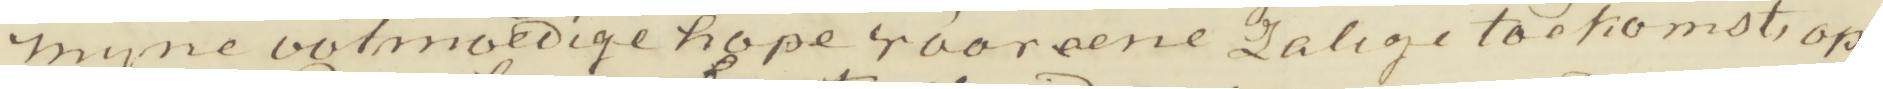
myne ootmoedige hope voor eene zalige toekomst op
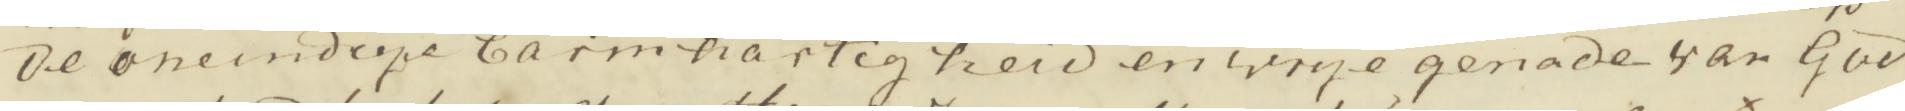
de oneindige barmhartigheid en vrye genade van God
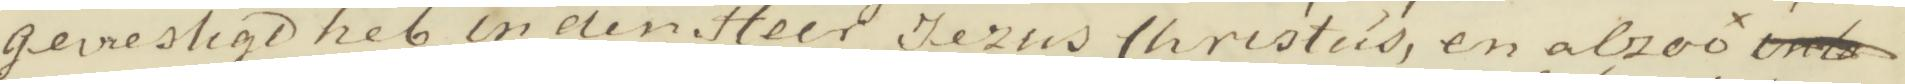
gevestigd heb in den Heer Jezus Christus, en alzoo x onte
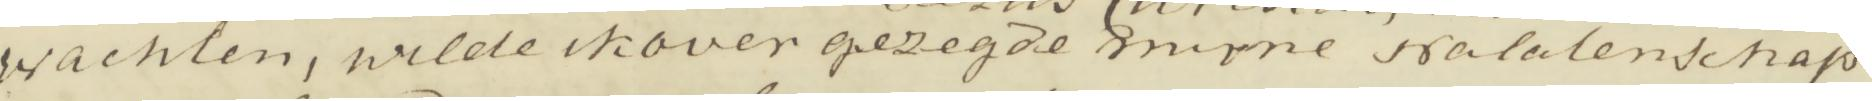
wachten, wilde ik over gezegde myne Nalatenschap
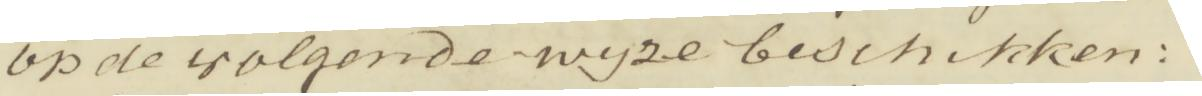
op de volgende wyze beschikken:
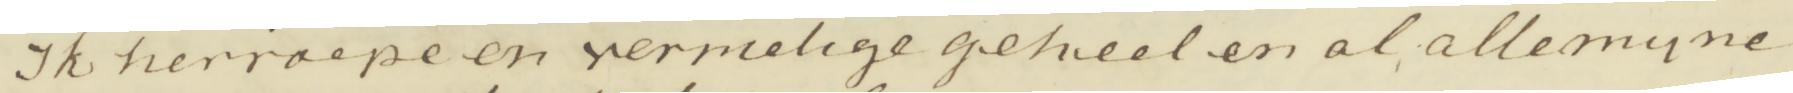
Ik herroepe en vernietige geheel en al alle myne
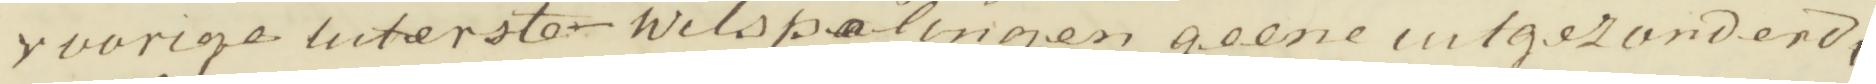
voorige uiterste wilspalingen geene uitgezonderd,
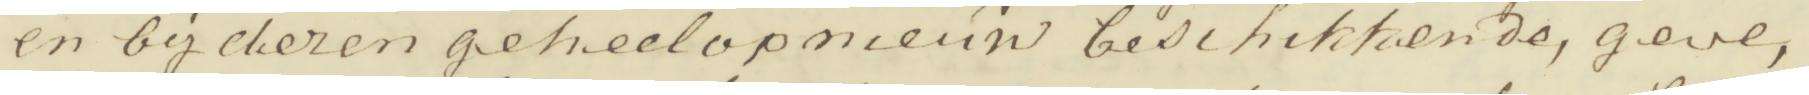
en bij dezen geheel opnieuw beschikkende, geve,
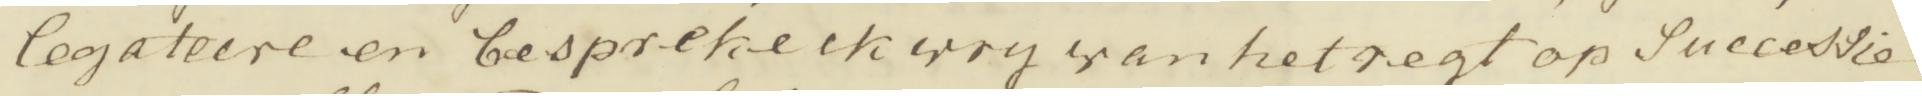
legateere en bespreke ik vry van het regt op successie
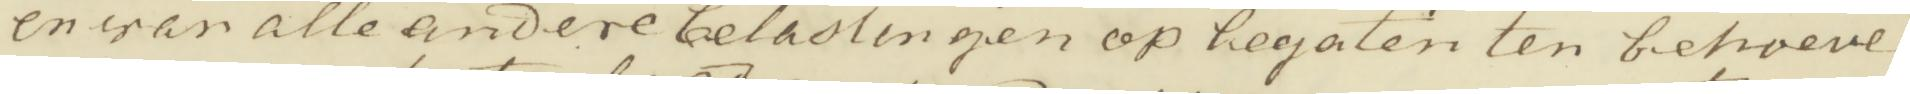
en van alle andere belastingen op legaten ten behoeve
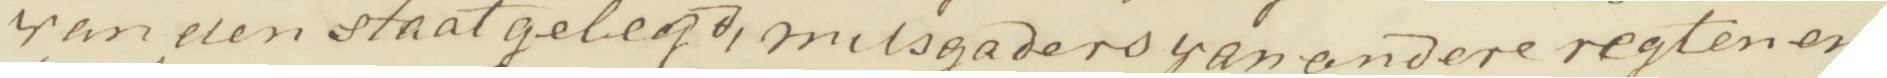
van den staat gelegd, mitsgaders van andere regten en
